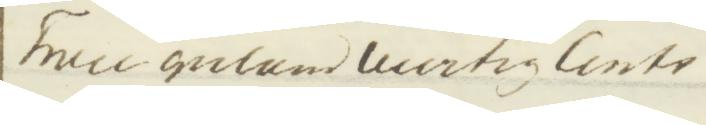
Twee gulden veertig Cents
